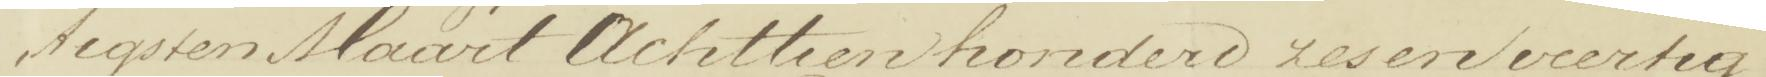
„tigsten Maart Achttien honderd zes en veertig
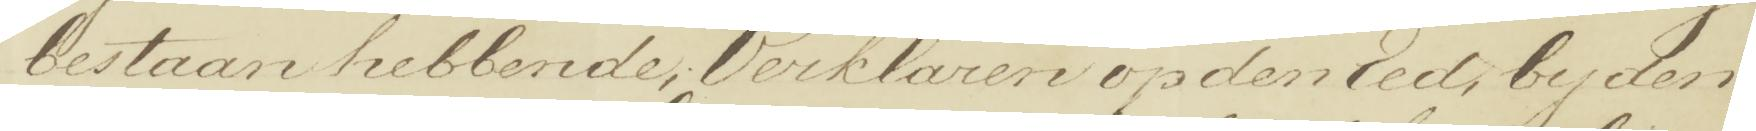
bestaan hebbende, Verklaren op den Eed, by den
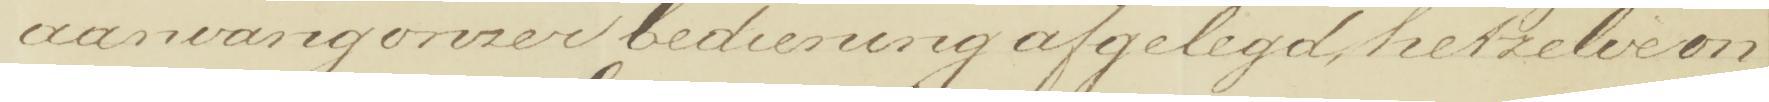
aanvang onzer bediening afgelegd, hetzelve on
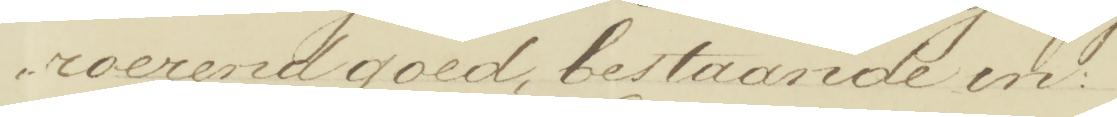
„roerend goed, bestaande in:
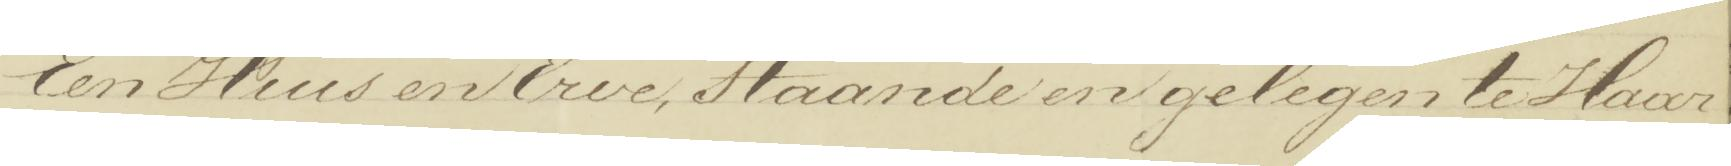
Een Huis en Erve, staande en gelegen te Haar
